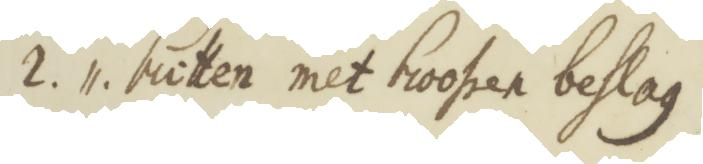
2. „. kitten met kooper beslag
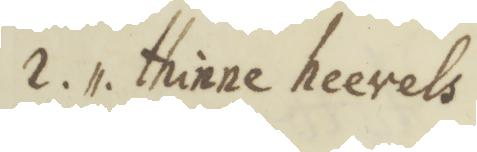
2. „. thinne heevels
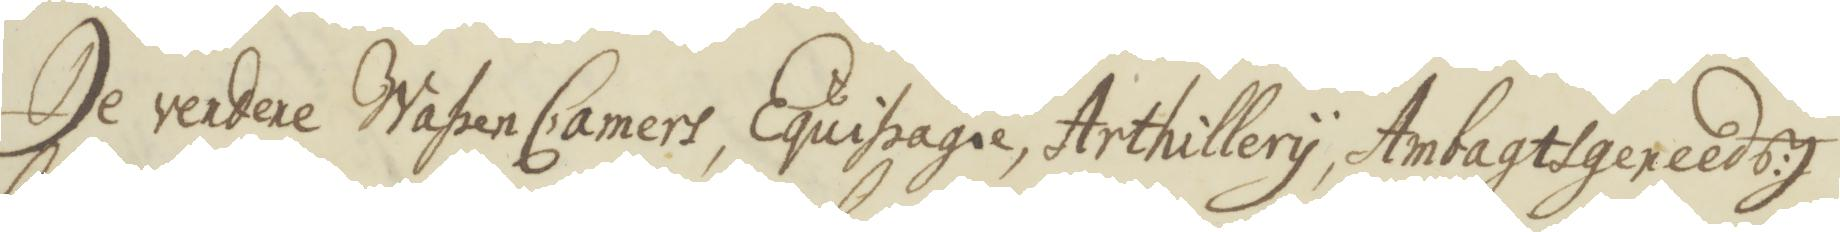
De verdere Wapen Camers, Equipagie, Arthillerij, Ambagtsgereeds:z
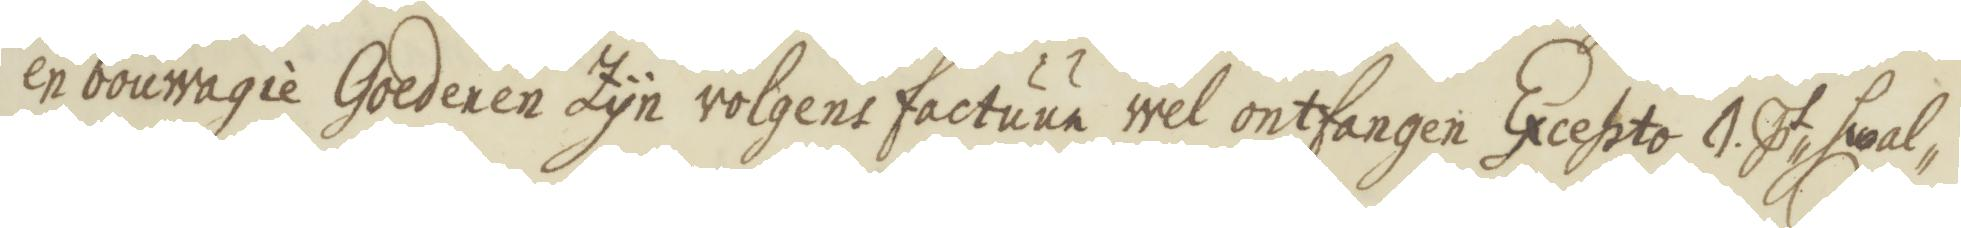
en bouwagie goederen zijn volgens factuur wel ontfangen Excepto 1. p„s swal„
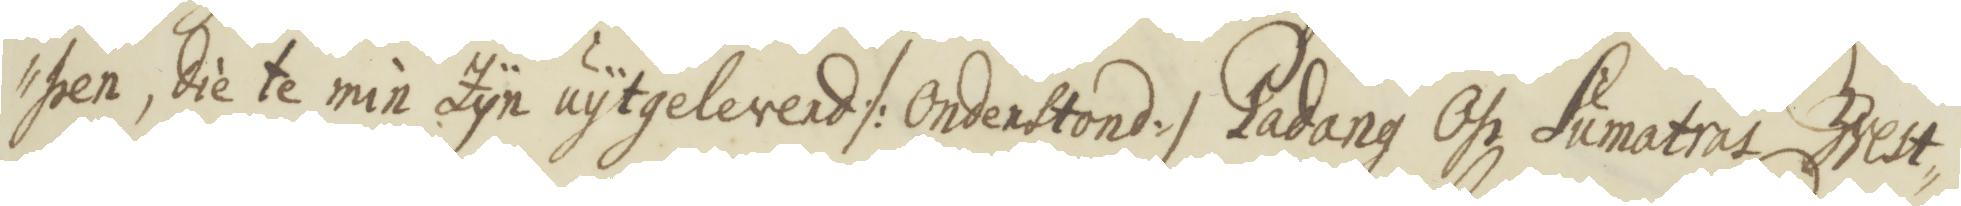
„pen, die te min zijn uijtgeleverd /: Onderstond :/ Padang op Sumatras West„
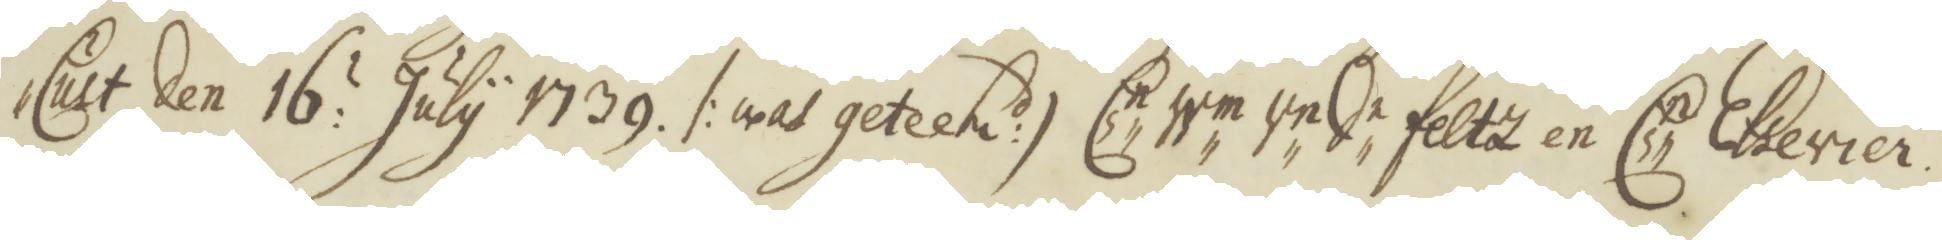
„Cust den 16:' Julij 1739. /:was geteek:/ C„n W„m V„n d„r Feltz en C„n Elsevier.
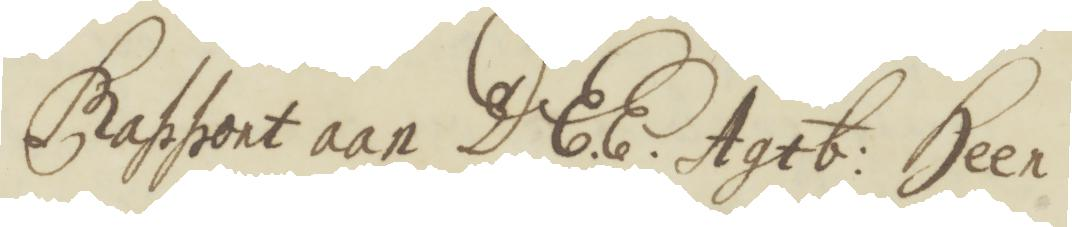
Rapport aan D’E.E. Agtb: Heer
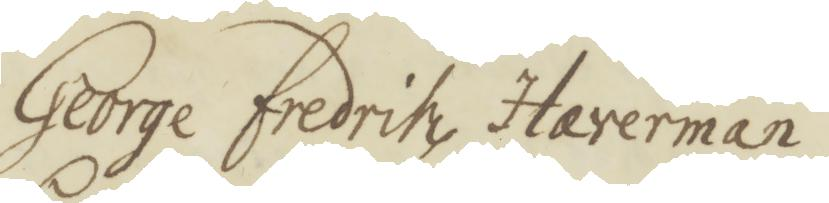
George Fredrik Haverman
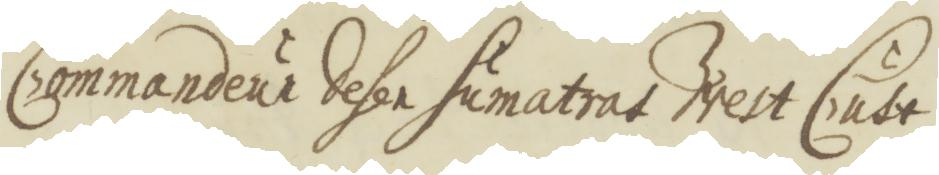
Commandeur deser Sumatras West Cust.
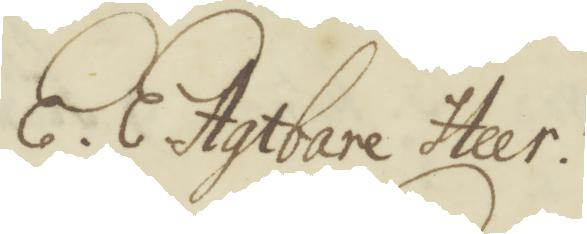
E.E. Agtbare Heer!
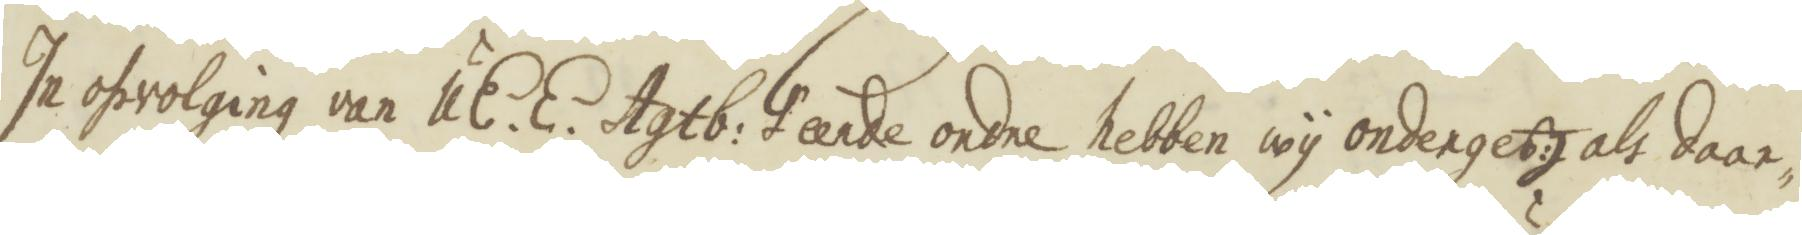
Jn opvolging van UE.E. Agtb: G'eerde ordre hebben wij onderges:z als daar„
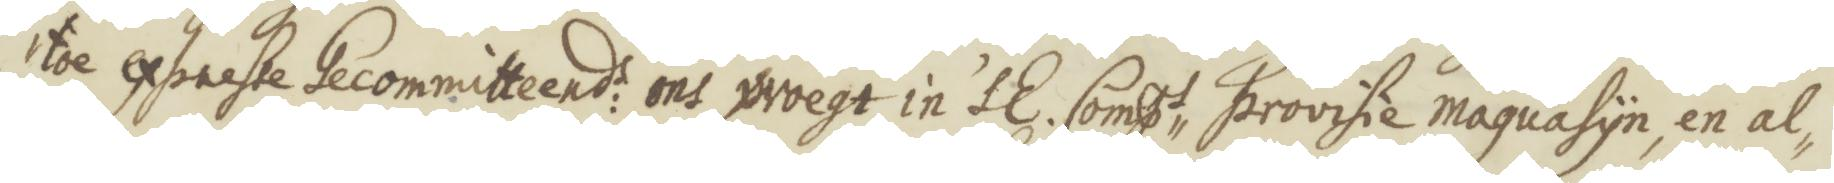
„toe expresse Gecommitteerd:s ons vervoegt in ’sE. Comp„s provisie maguasijn en al„
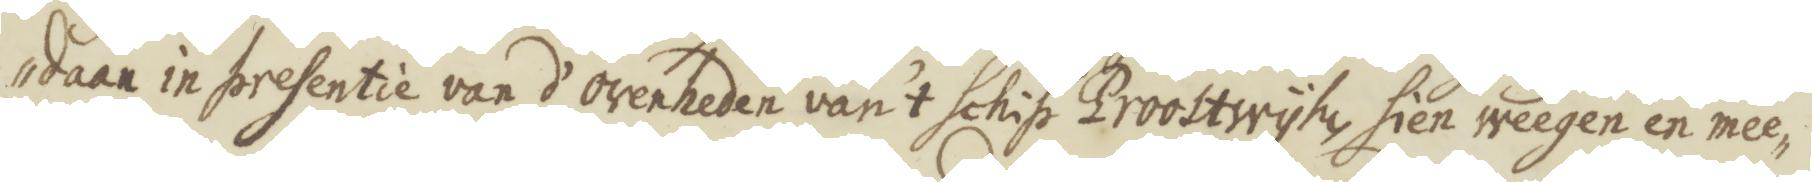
„daar in presentie van d’ overheden van ’t schip Proostwijk sien weegen en mee„
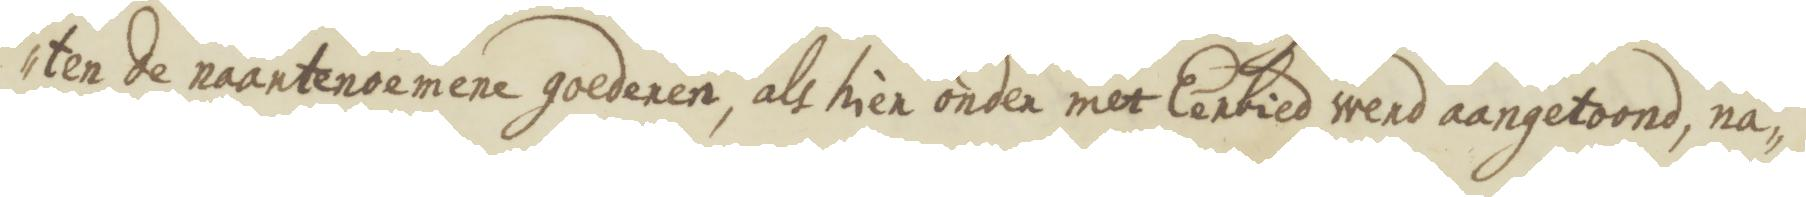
„ten de naartenoemene goederen, als hier onder met Eerbied werd aangetoond, na„
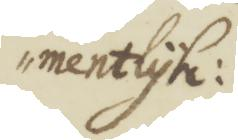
„mentlijk:
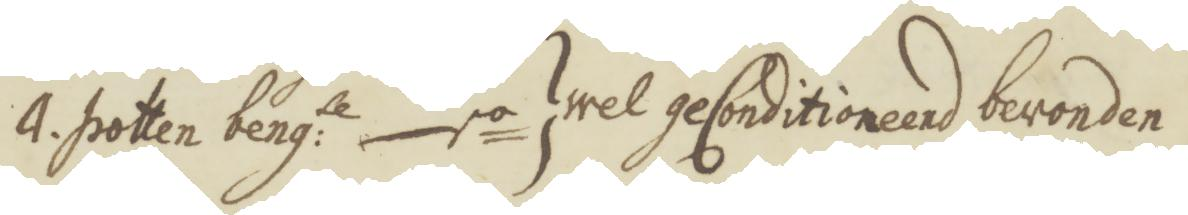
4. potten beng:se _=o } wel geconditioneerd bevonden
